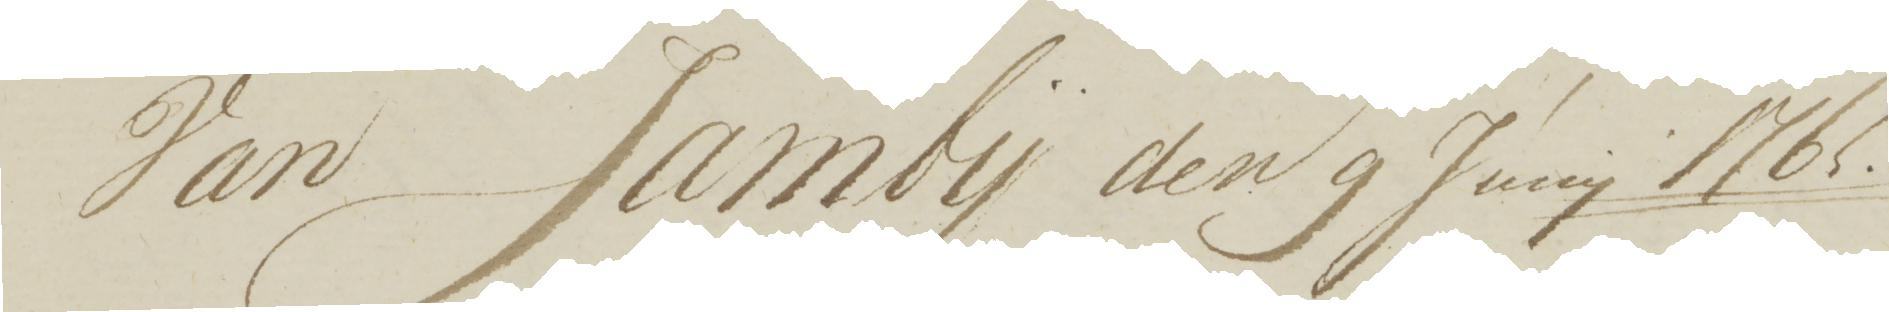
Van Jambij den 9 Junij 1765.
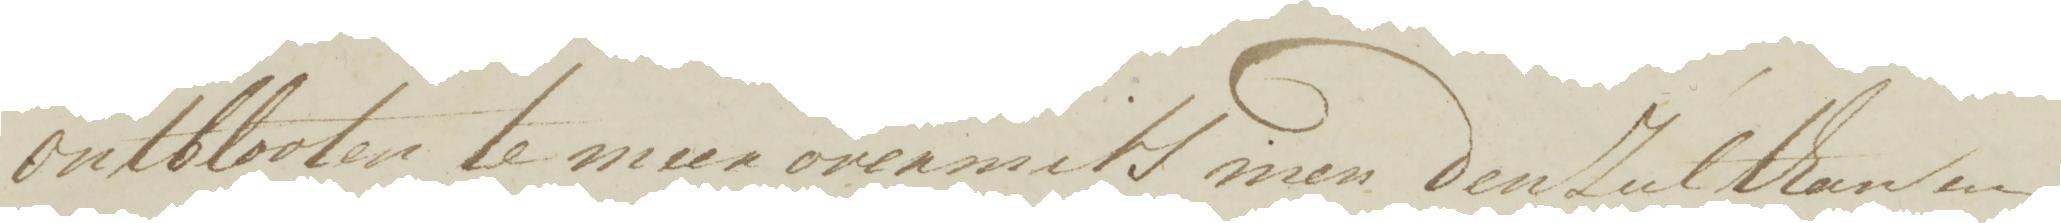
ontblooten te meer overmits men den zulthan en
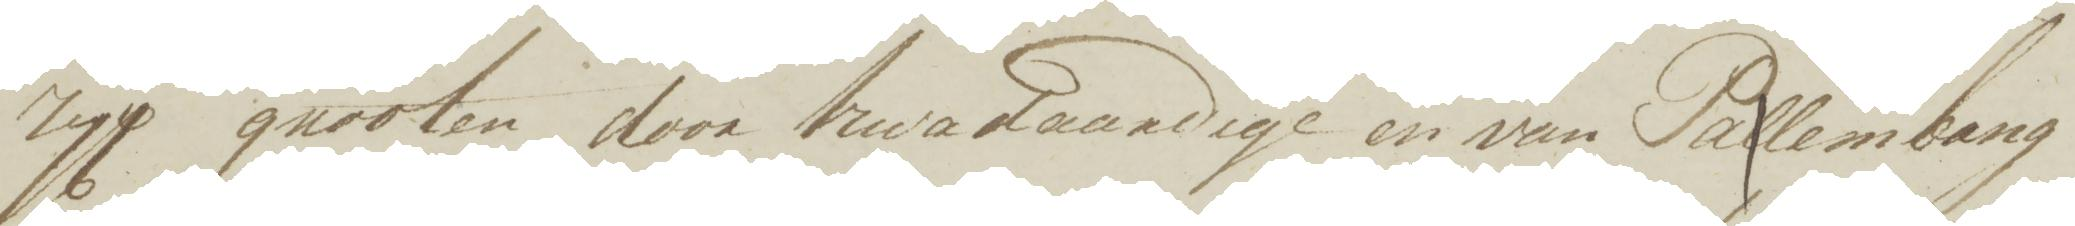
zijn grooten door kwadaardige en van Pallembang
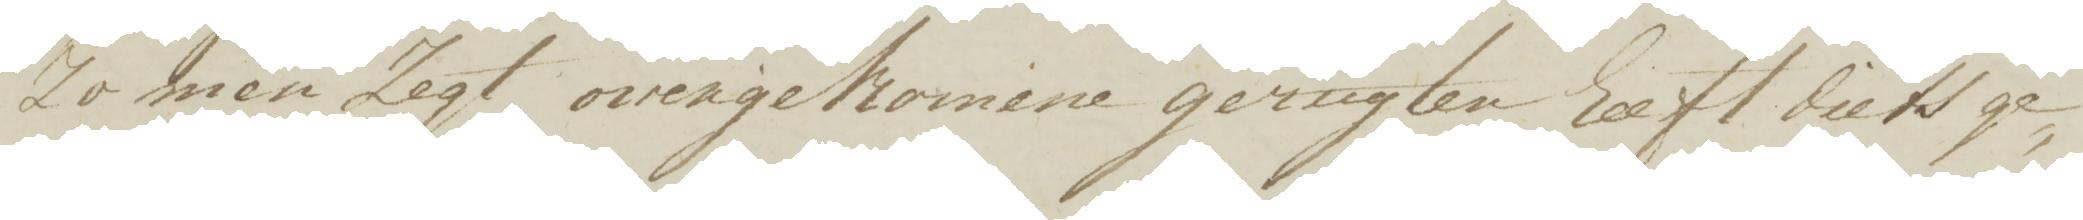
zo men zegt overgekomene gerugten heeft diets ge„
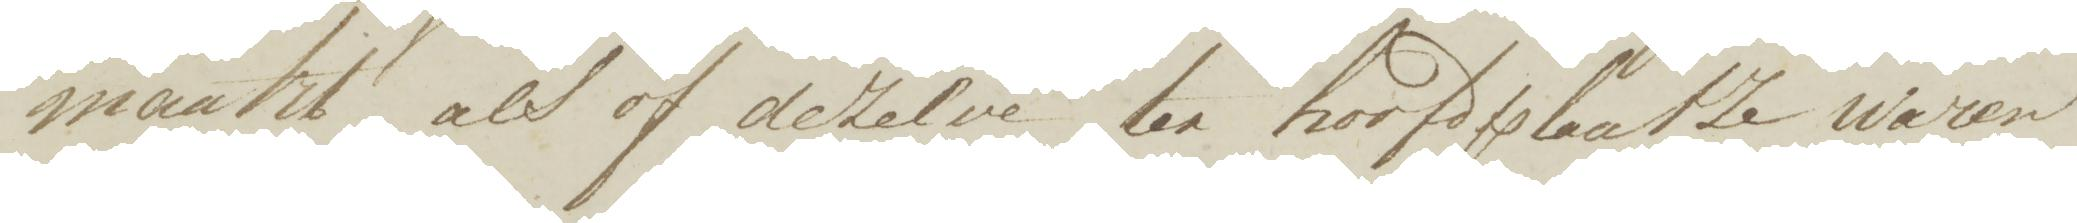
maakt als of dezelve ter hoofdplaatze waren
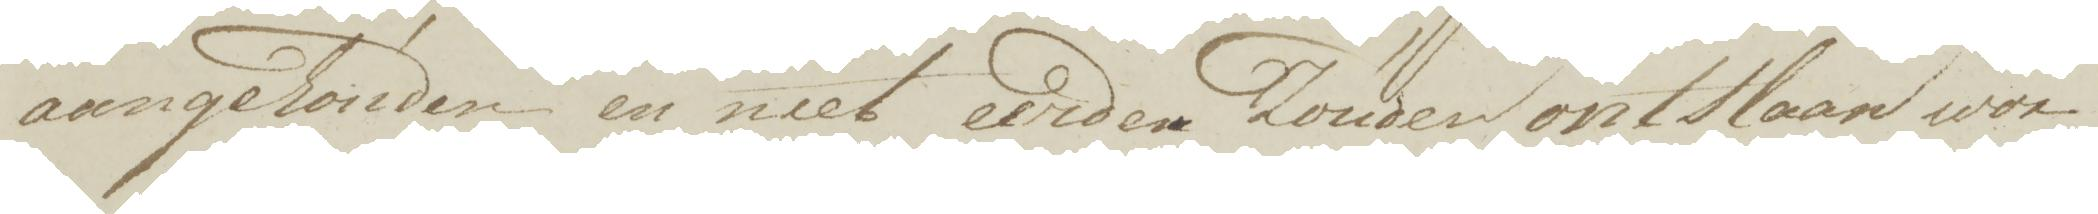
aangehouden en niet eerden zouden ontslaan wor
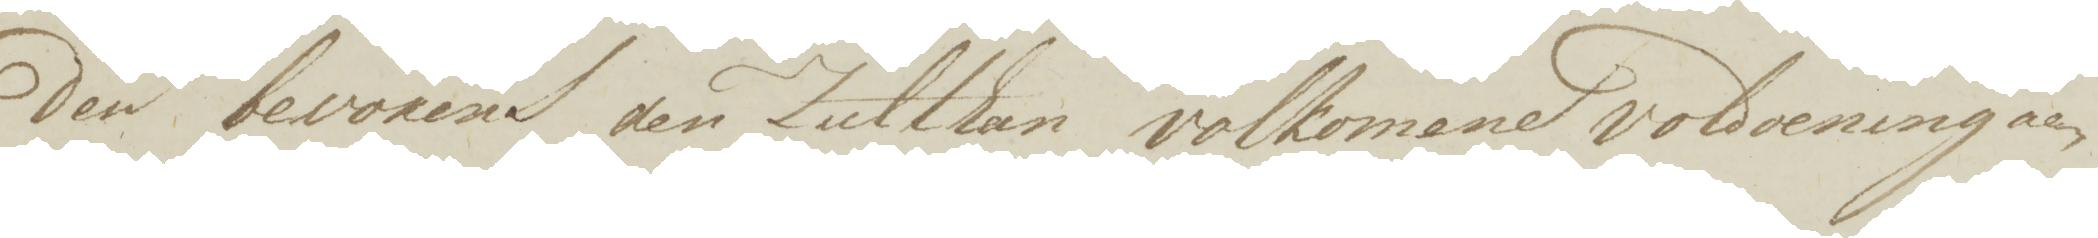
den bevorens den zulthan volkomene voldoening aen
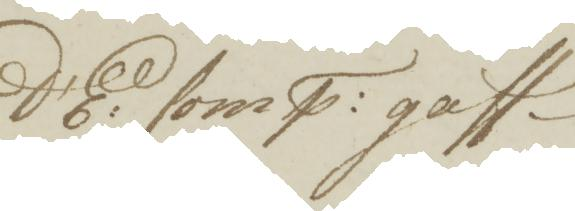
d’E: Comp: gaff.
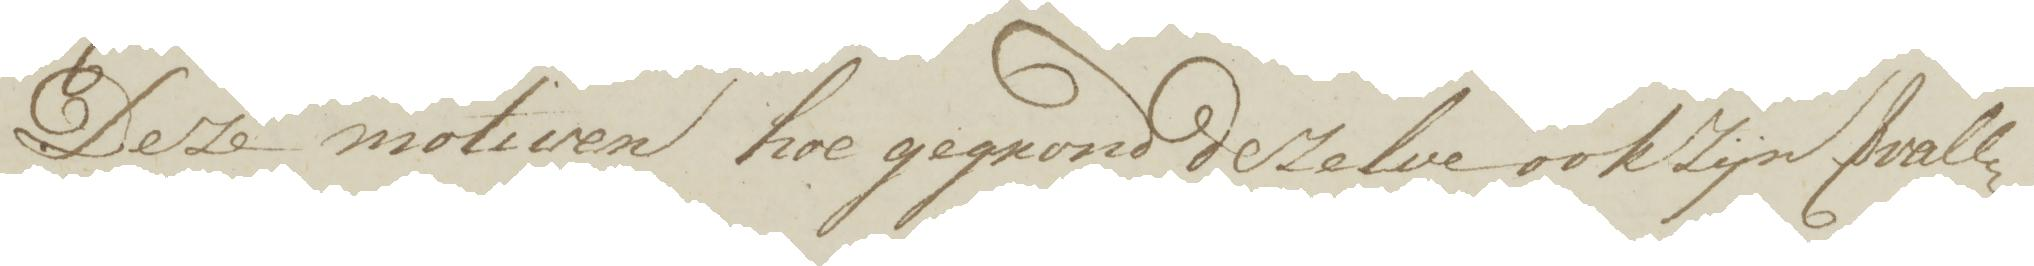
Deze motiven hoe gegrond dezelve ook zijn vervallen
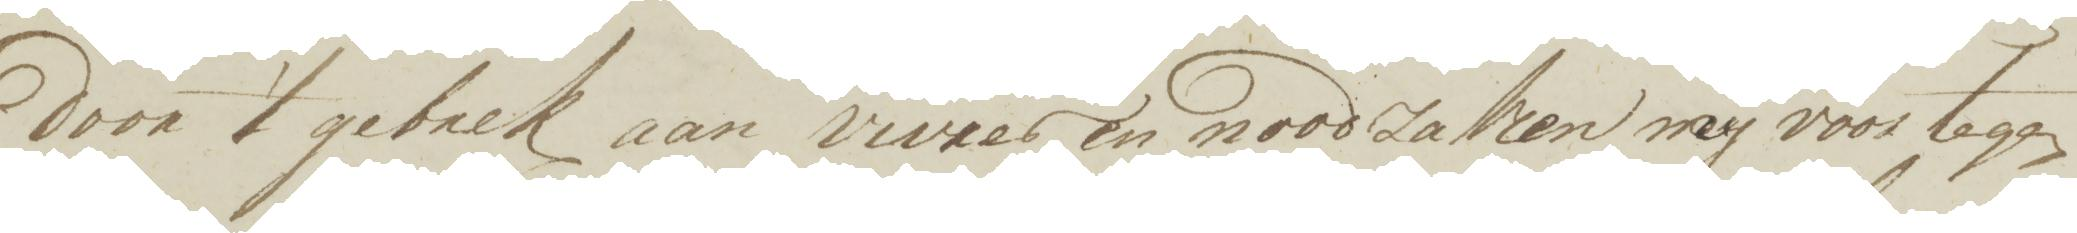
door ’t gebrek aan vivres en noodzaken mij voor tegen
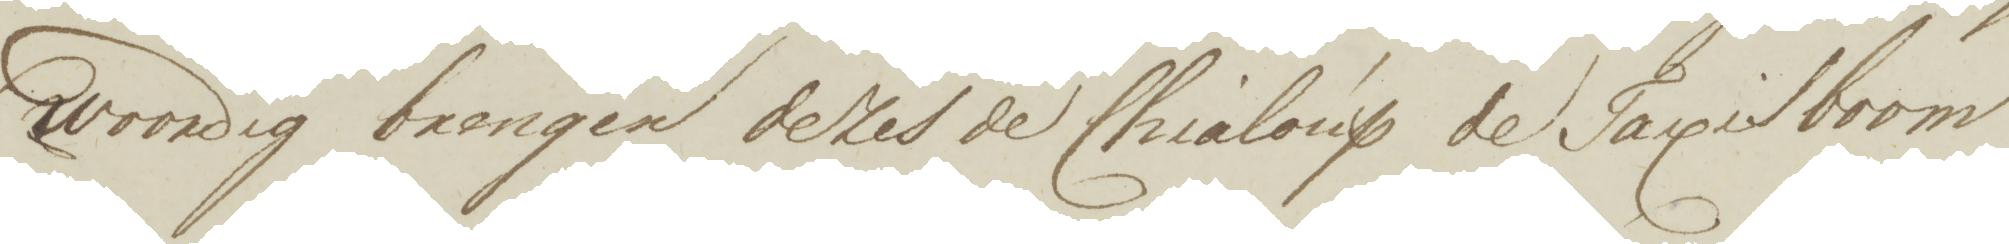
woordig brengen dezes de Chialoup de Taxis boom
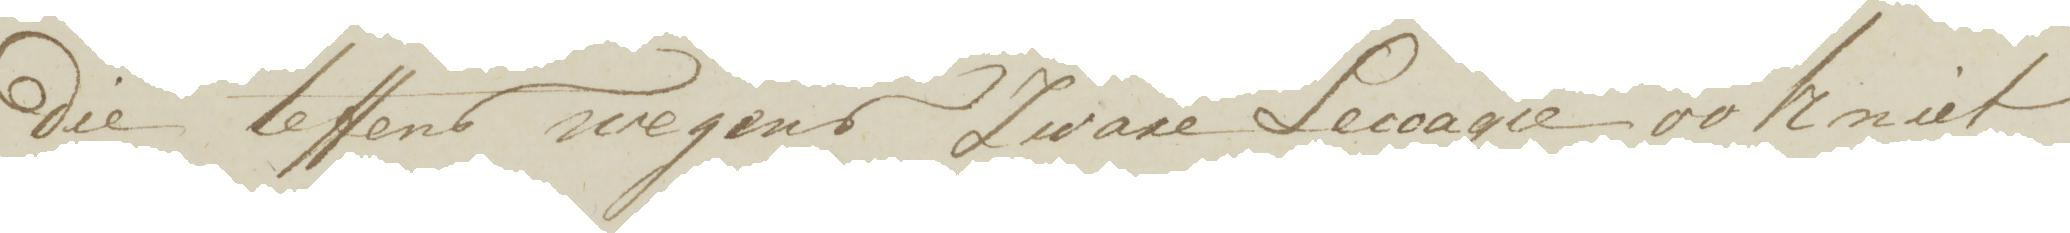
die teffens wegens zware Sewagie ook niet
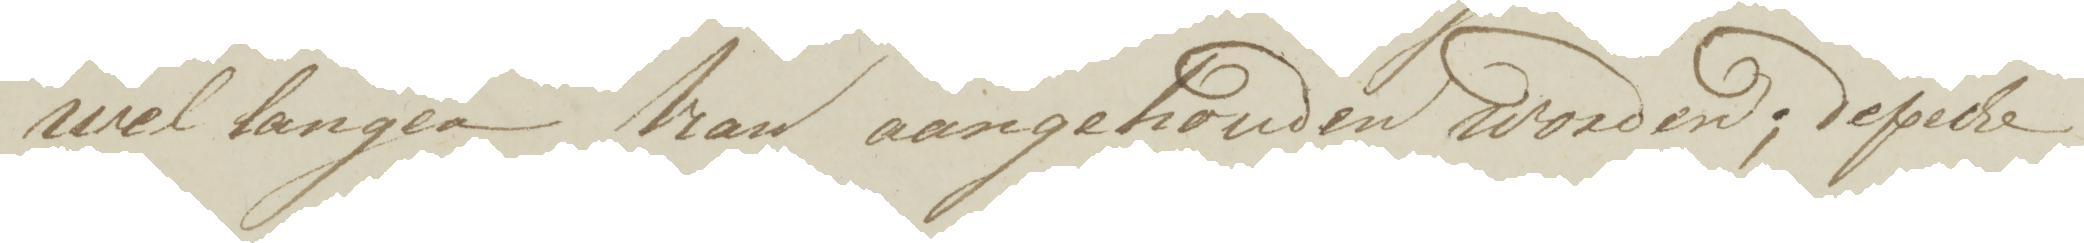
wel langer kan aangehouden worden; depeche
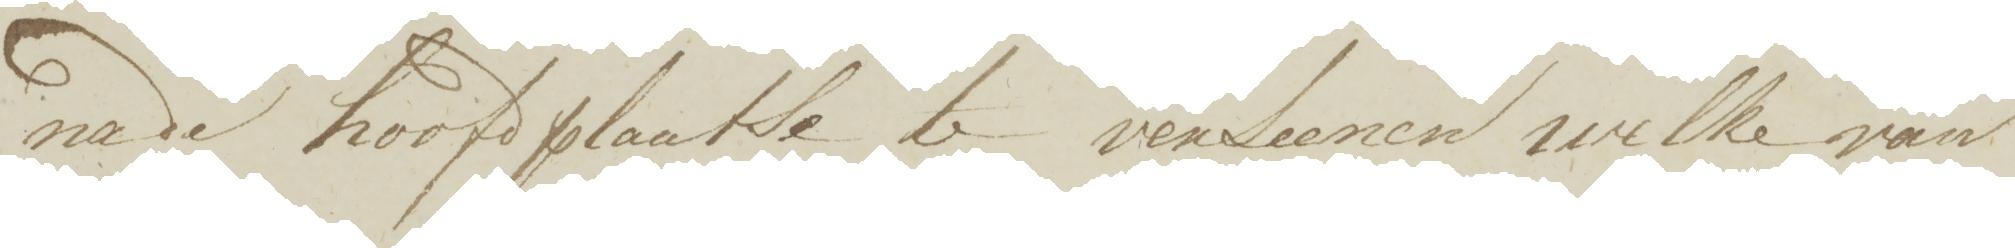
na de hoofdplaatse te verleenen welke van
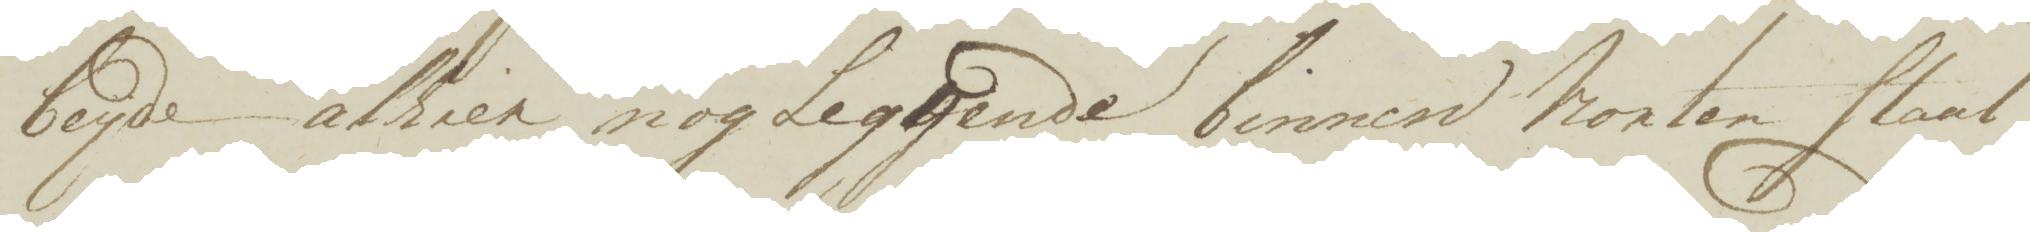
beijde alhier nog leggende binnen korten staat
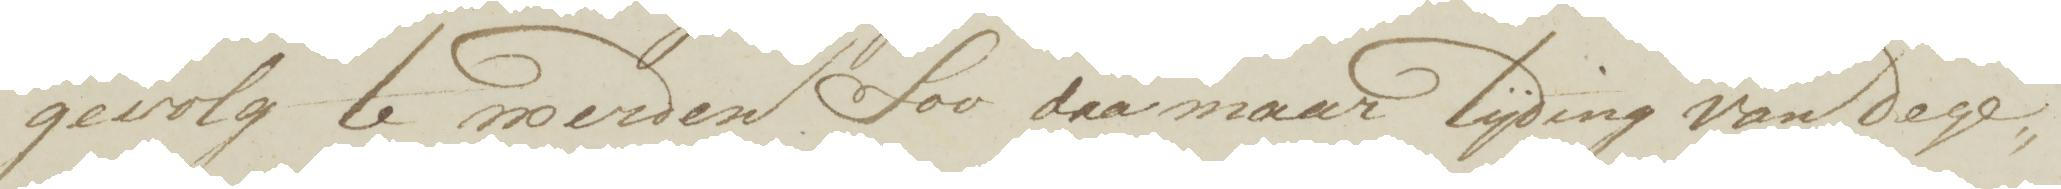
gevolg te werden soo dra maar tijding van de ge„
